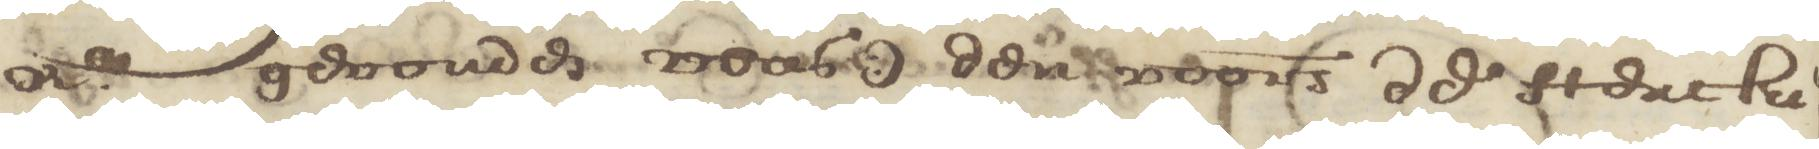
r.a gevonden was:) den voorts de stercke
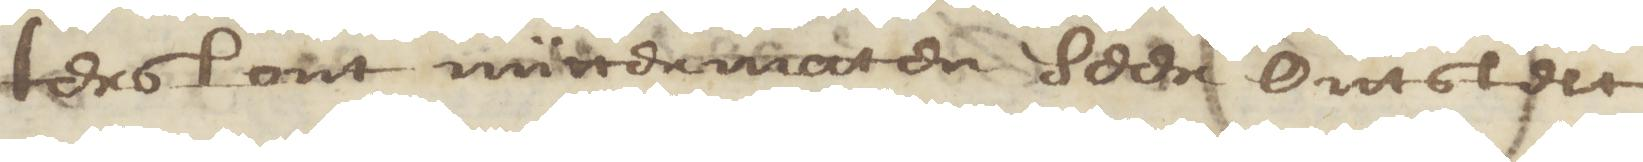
terstont mittermaten seer Ontstelt
